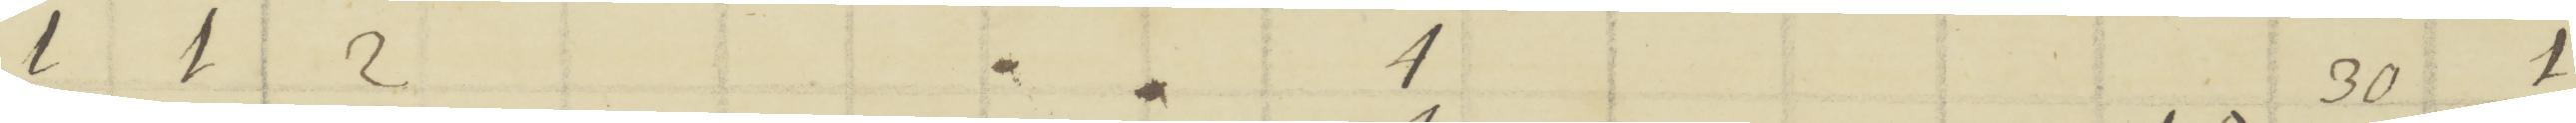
1 1 2 4 30 1
